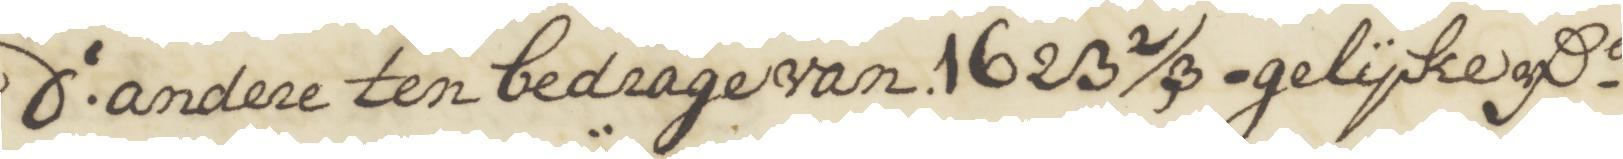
d.' andere ten bedrage van. 1623 2/3 - gelijke rp_s
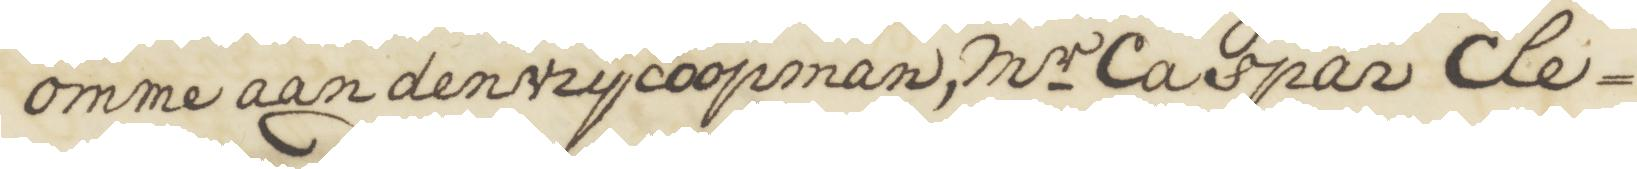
omme aan den vrijcoopman, M_r Caspar Cle=
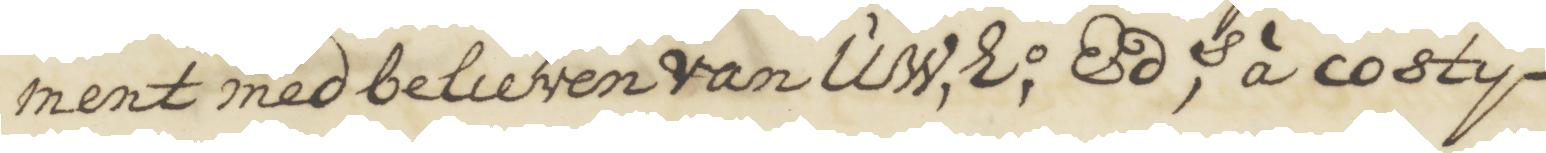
ment med believen van UW, h,o Ed,s â costij
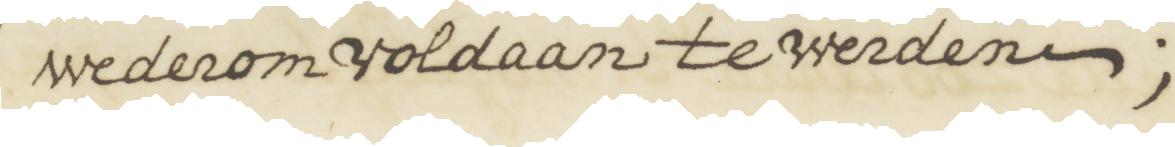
wederom voldaan te werden;
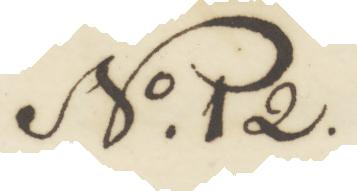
N.o 12.
